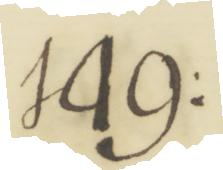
149:
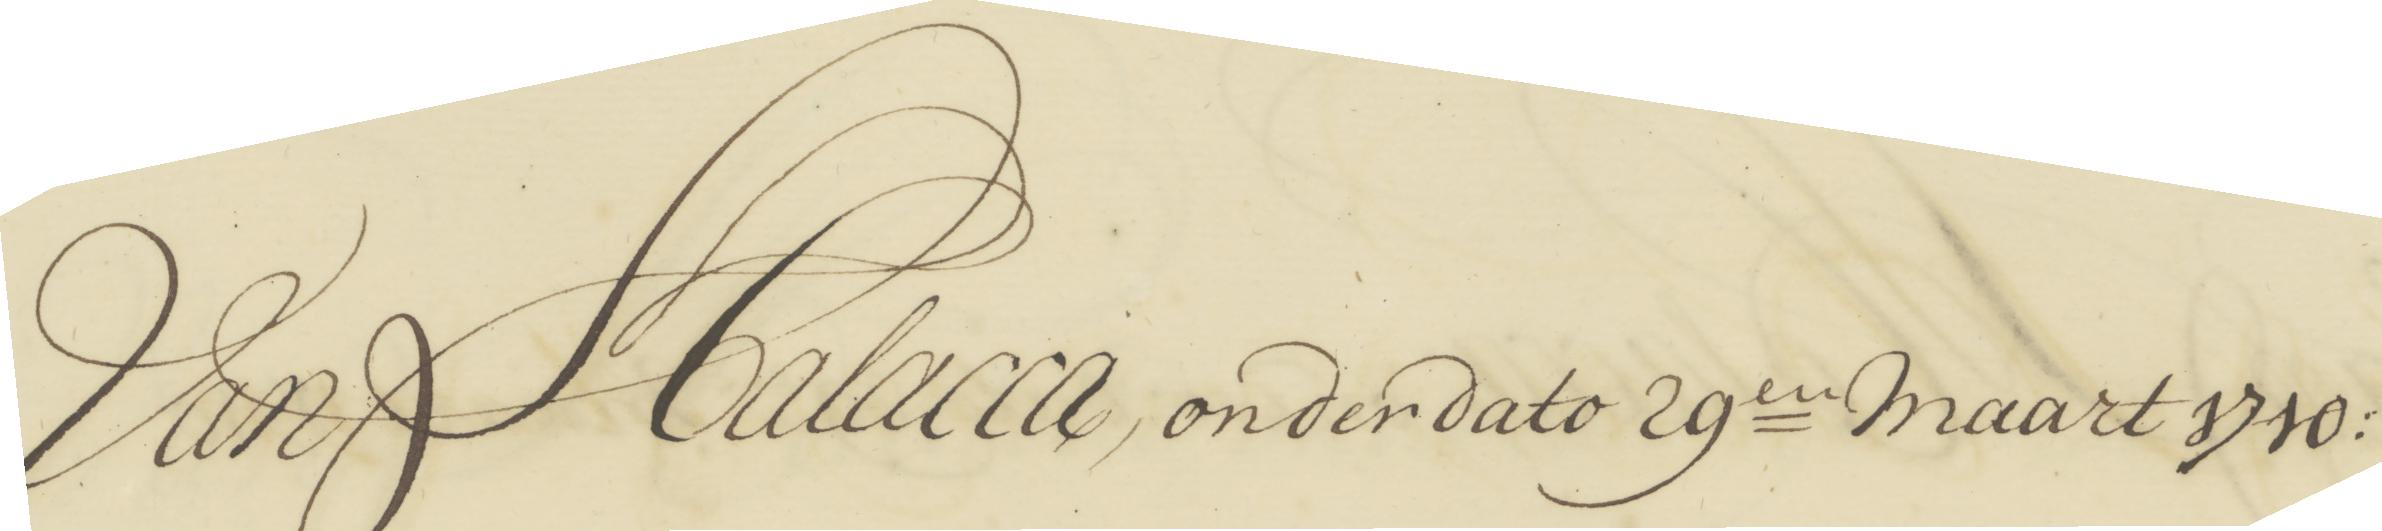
Van Malacca, onder dato 29=en maart 1710:
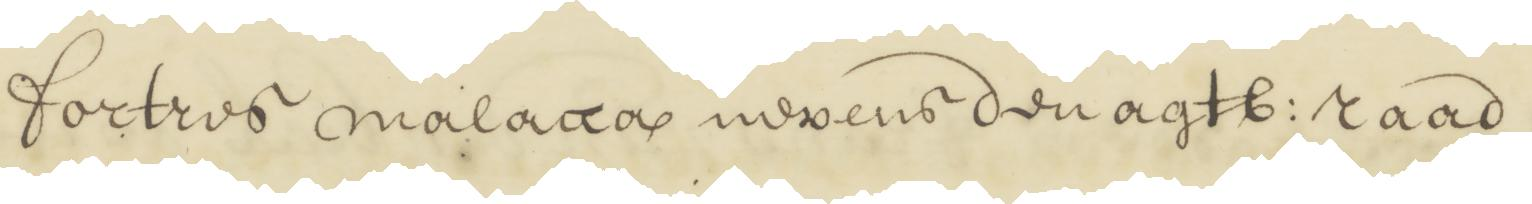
fortres malacca nevens den agtb: raad
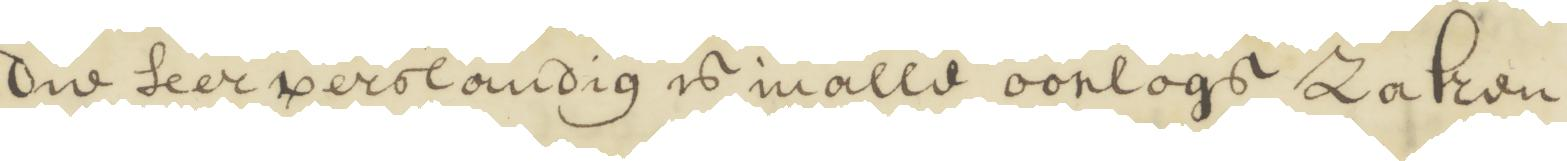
die seer verstandig is in alle oorlogs Zaken
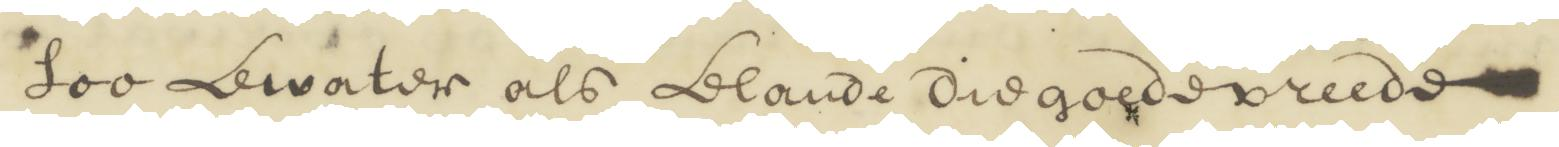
soo tewater als telande die goede vreede
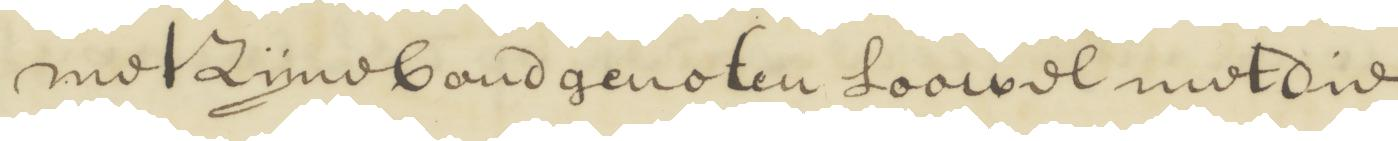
metZijnebond genoten soowel met die
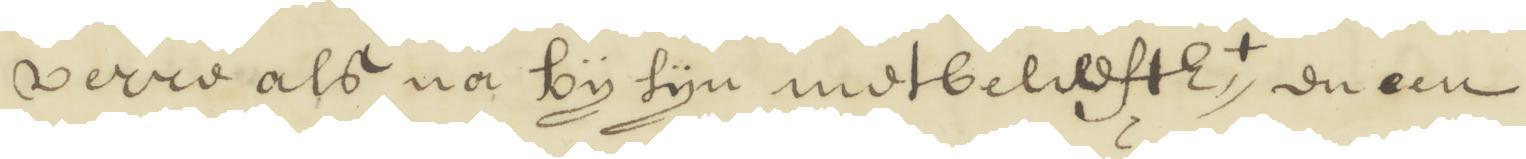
verre als na bij sijn met beleefth„t en een
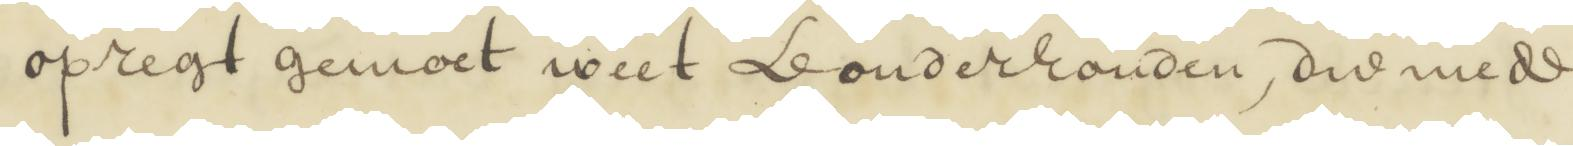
opregt gemoet weet te onderhouden, die mede
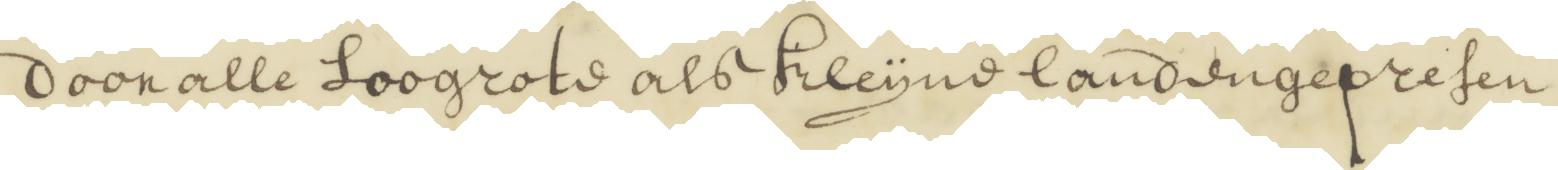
door alle Soogrote als kleijne landengepresen
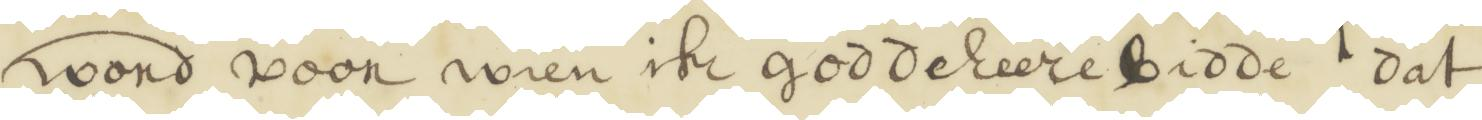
word voor wien ik god deheere bidde dat
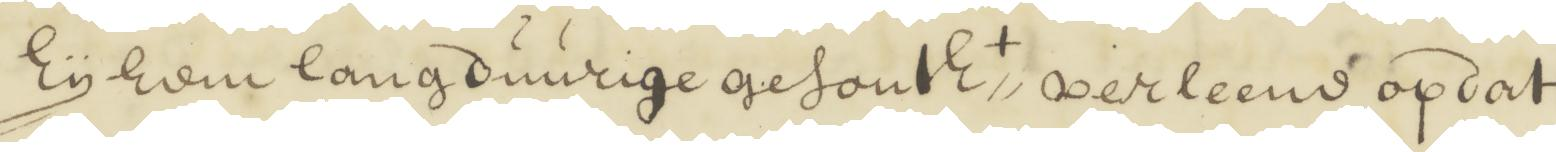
hij hem langduurige gesonth„t verleene op dat
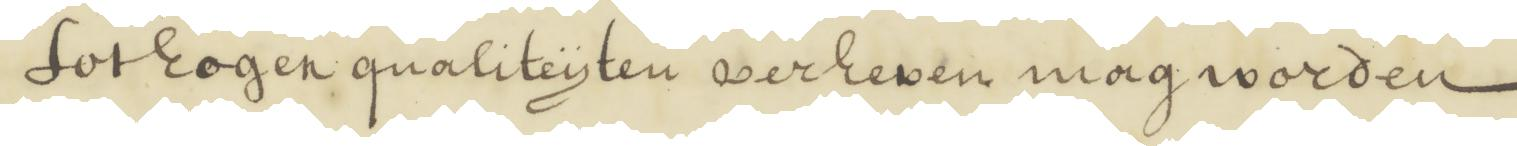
tot hoger qualiteijlen verheven mag worden
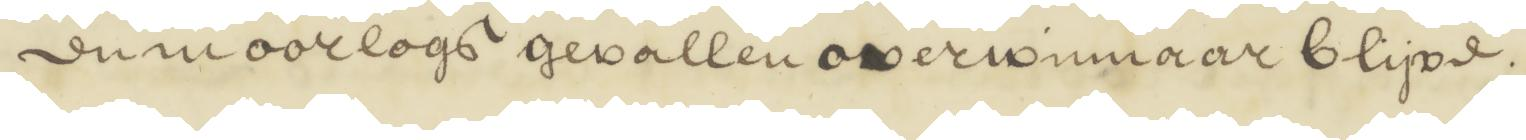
en in oorlogs gevallen overwinnaar blijve;
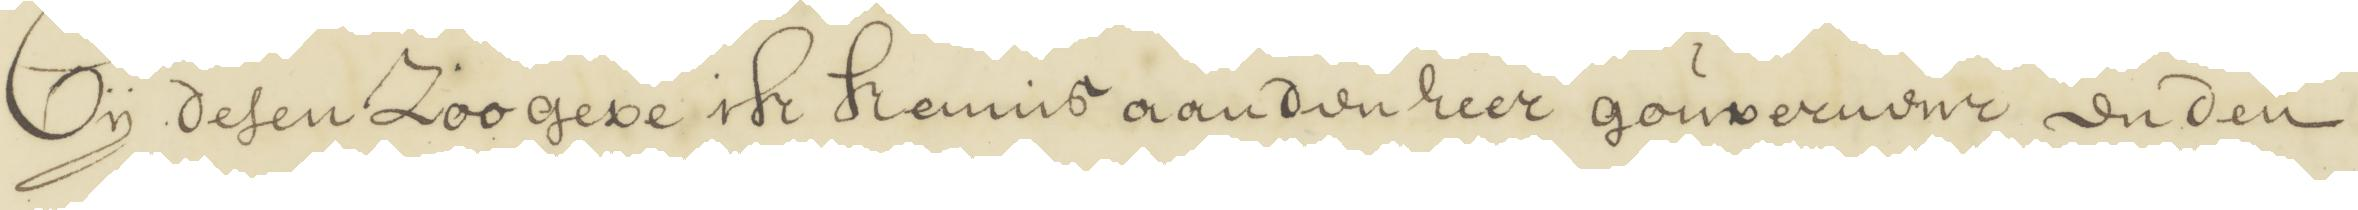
Bij desen Zoo geve ik kennis aan den heer gouverneur en den
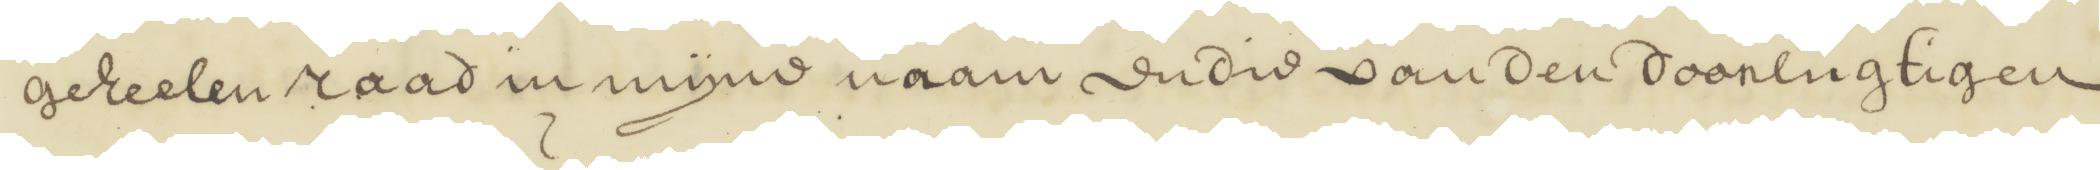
geheelen raad in mijne naam en die van den doorlugtigen
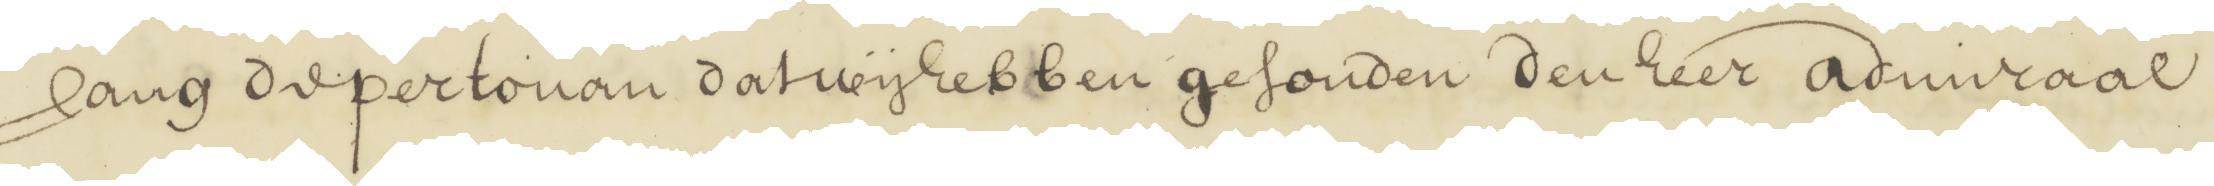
Jang depertouan datwijhebben gesonden den heer admiraal
